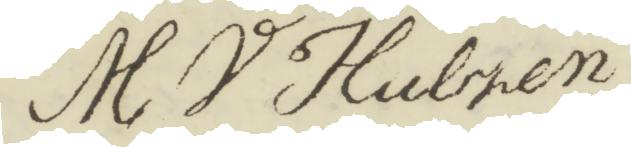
M V Hulspen
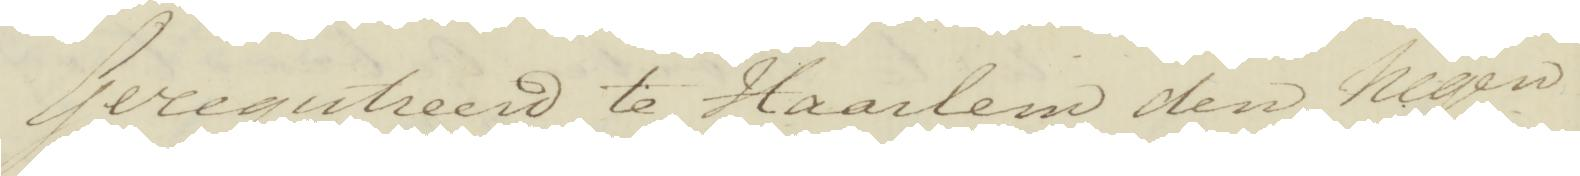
Geregistreerd te Haarlem den Negen
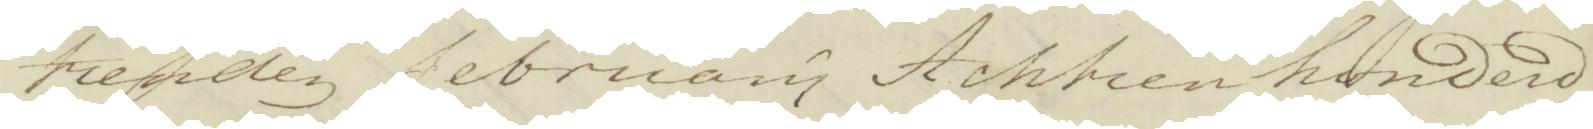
tienden Februarij Achtien honderd
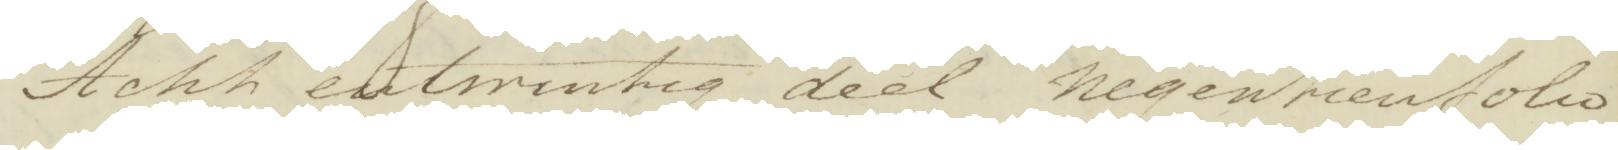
Acht entwintig deel negentien folio
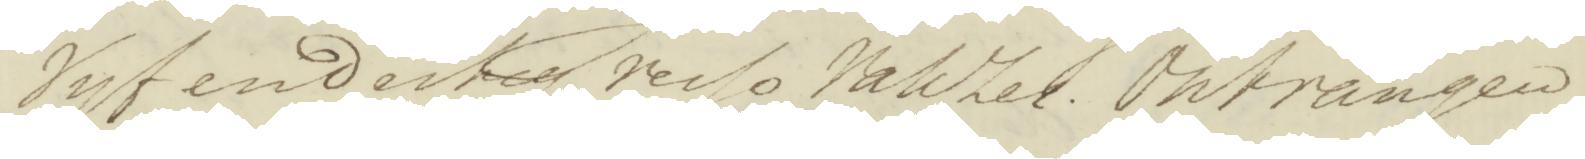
Vyf en dertig verso Vak zes. Ontvangen
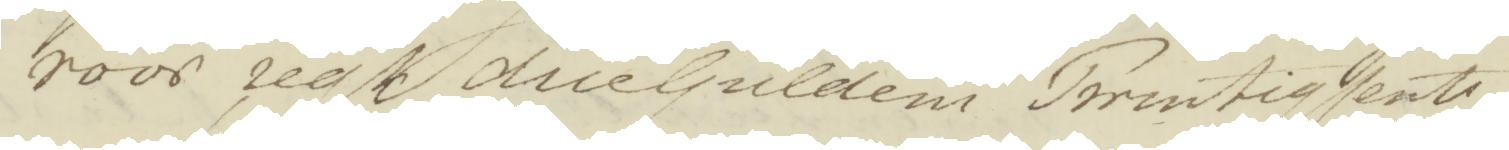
voor regt drie Guldens Twintig Cents
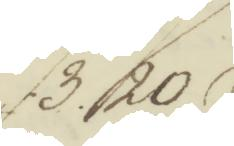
ƒ3. 20
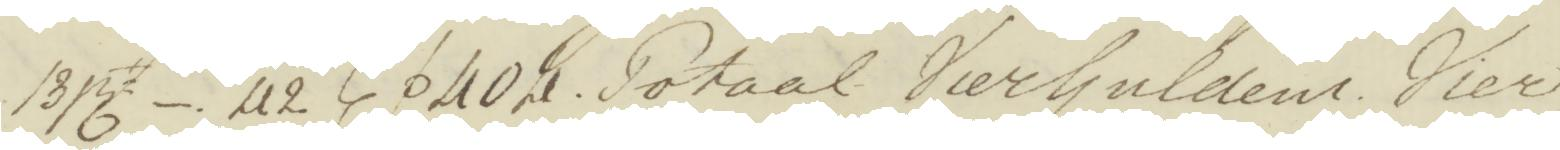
13 pC=t —. 42 ƒ404. Totaal Vier Guldens. Vier
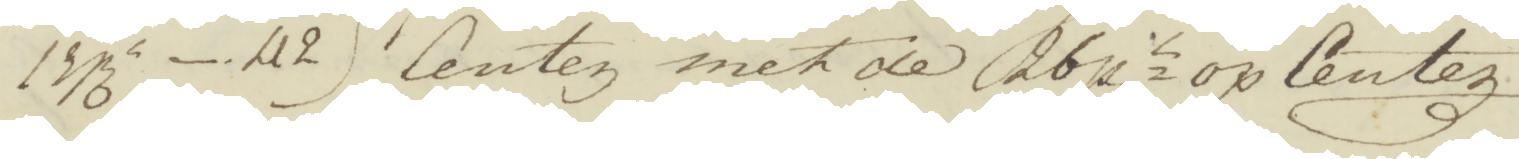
13 pCt —. 42 Centen met de 26pC=t op Centen
